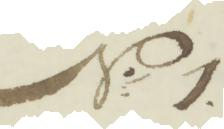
N=o 1.
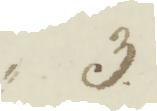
„ 3.
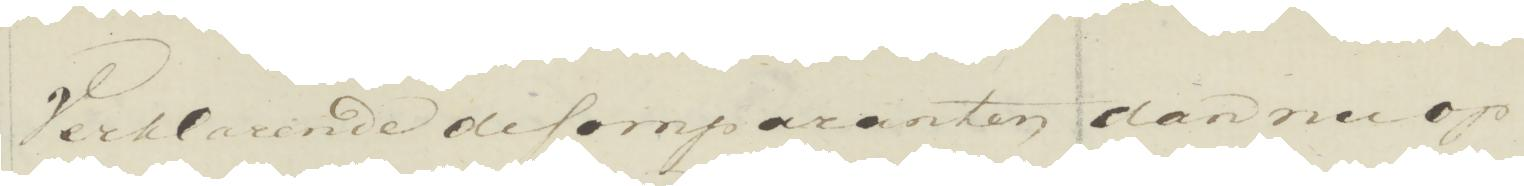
Verklarende de Comparanten dan nu op
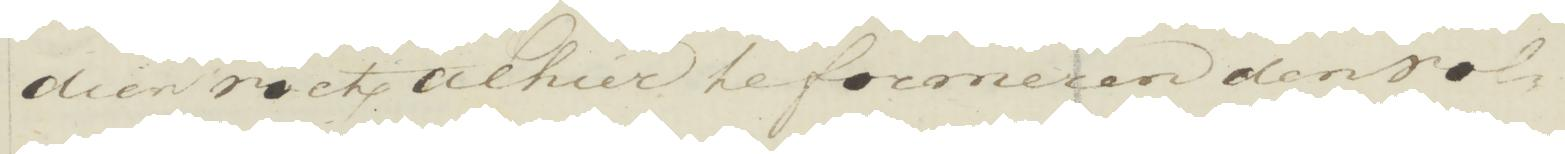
dien rechte alhier te formeren den vol„
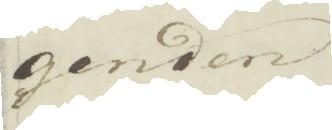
genden
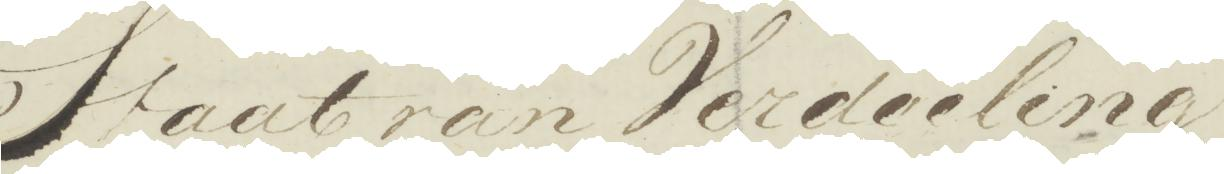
Staat van Verdeeling
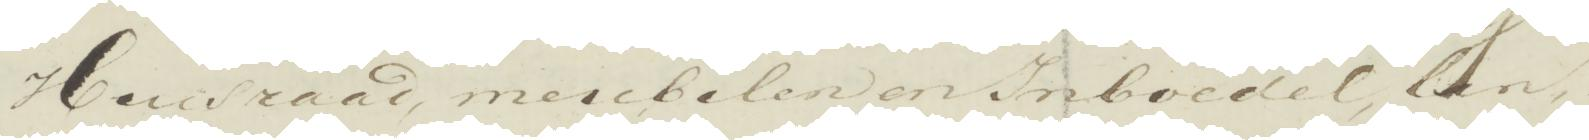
Huisraad, meubelen en Inboedel, lin,
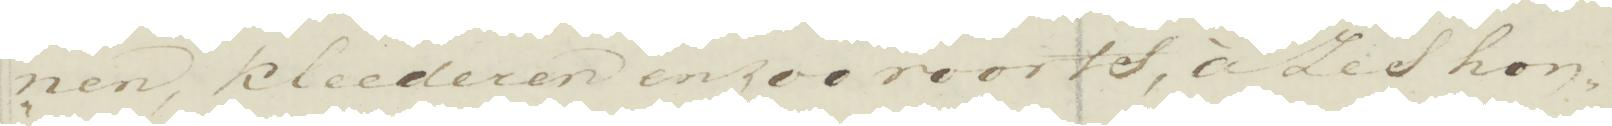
nen, kleederen en zoo voorts, à Zes hon„
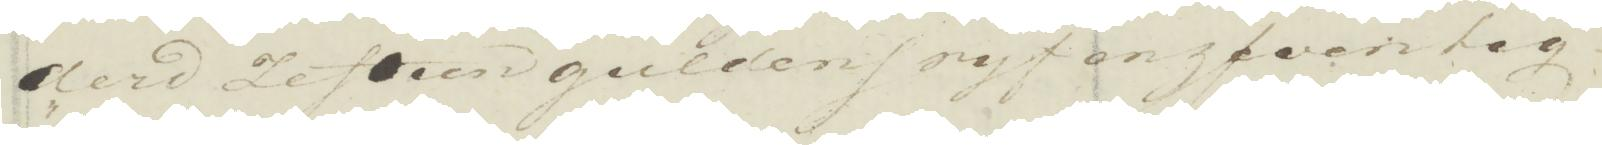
„derd zestien gulden vyf en zeventig
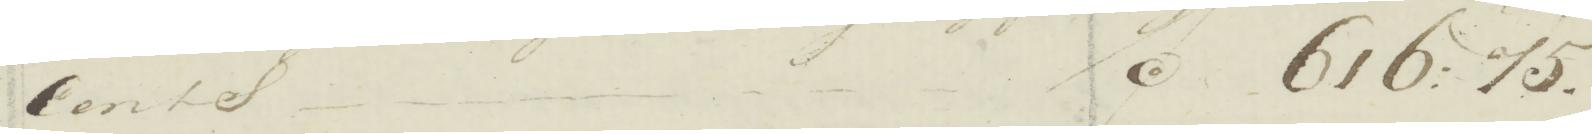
Cents ƒ 616:75.
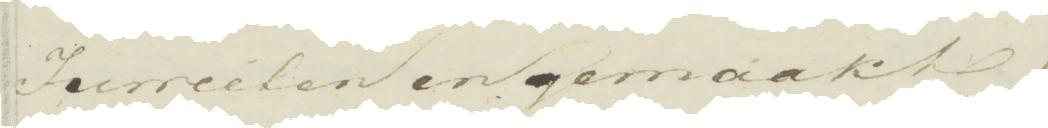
Iuweelen en gemaakt
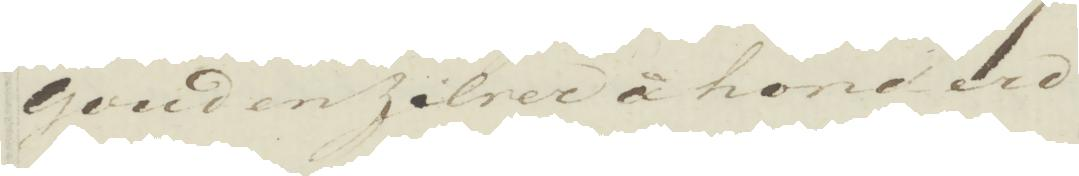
goud en zilver à honderd
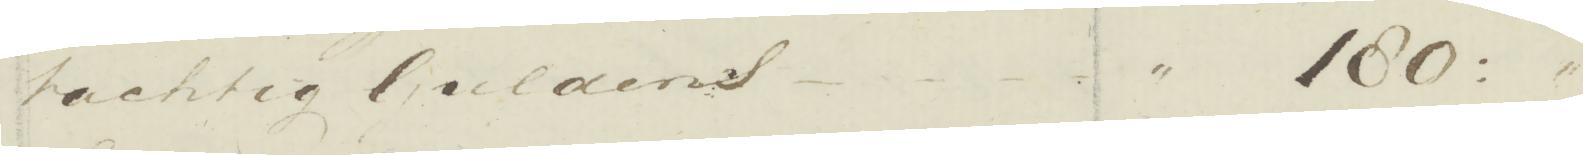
tachtig Guldens - - - - „ 180: „
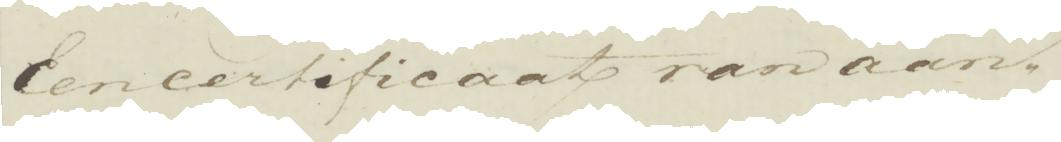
Een certificaat van aan„
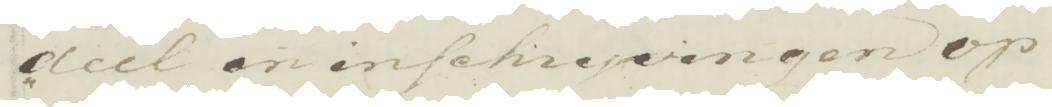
deel en inschryvingen op
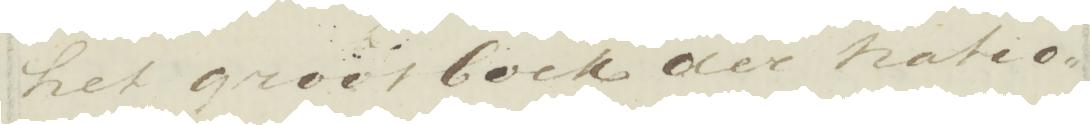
het groot boek der natio„
